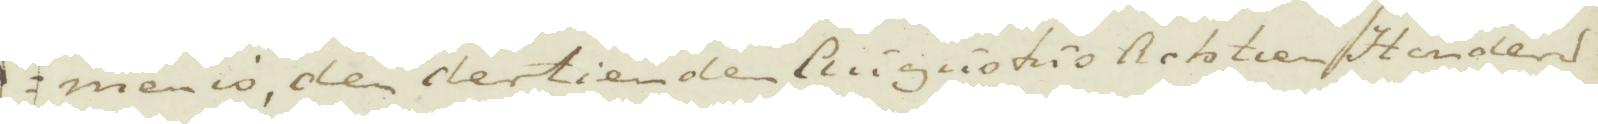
=men is, den dertiende Augustus Achtien Honderd
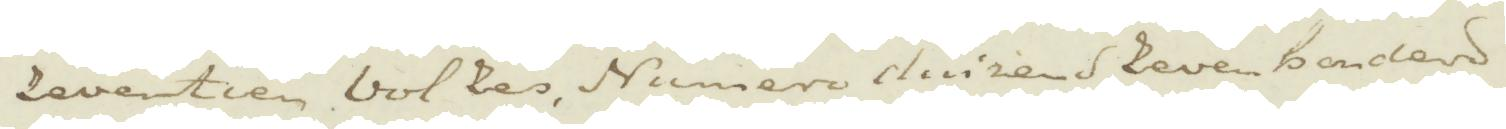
zeventien, vol zes, Numero duizend zeven honderd
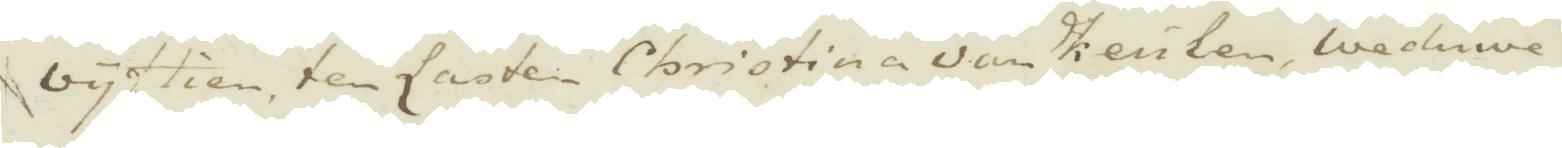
vijftien, ten Lasten Christina van Keulen, weduwe
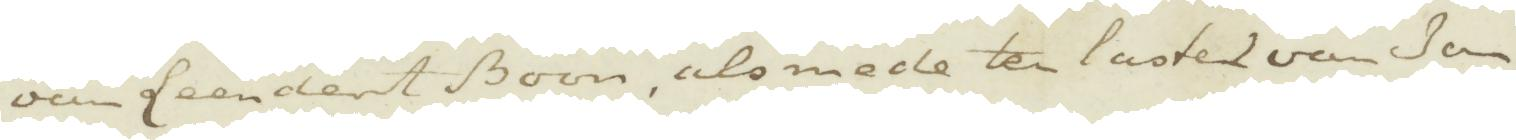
van Leendert Boon, als mede ten lasten van Jan
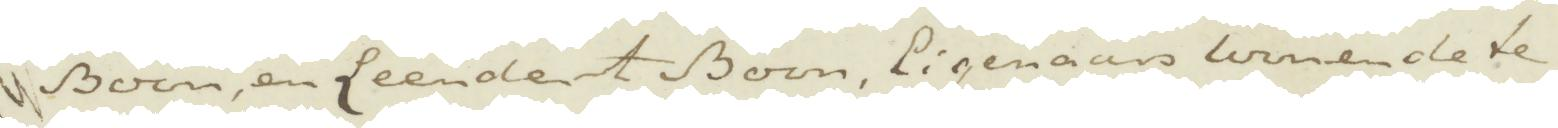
Boon, en Leendert Boon, Eigenaars wonende te
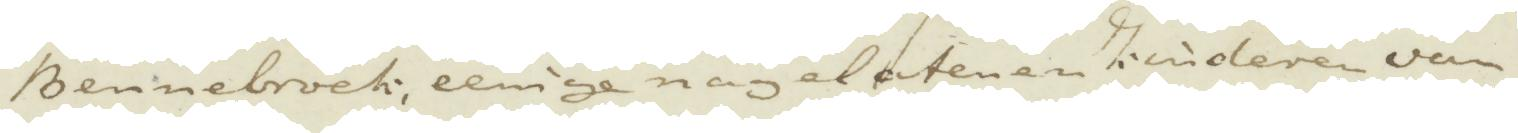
Bennebroek, eenige nagelatenen kinderen van
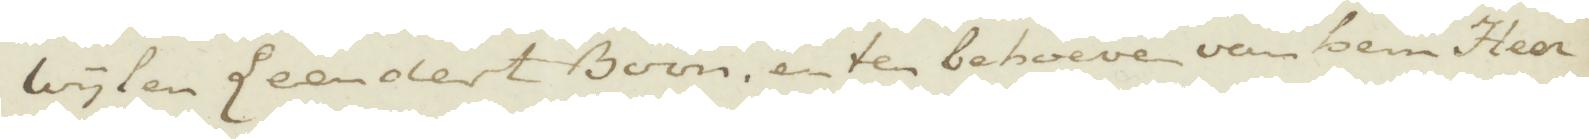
wijlen Leendert Boon, en ten behoeven van hem Heer
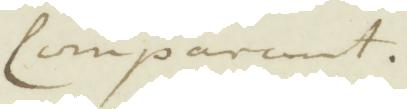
Comparant.
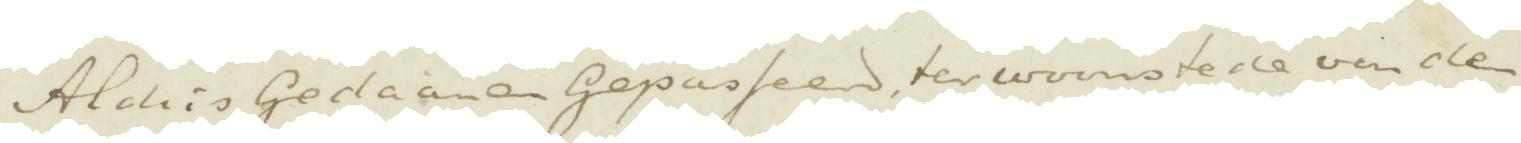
Aldus Gedaan en Gepasseerd, ter woonstede van den
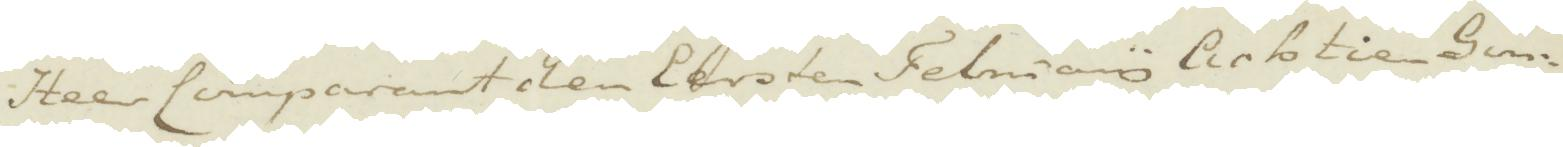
Heer Comparant den Eersten Februarij Achtien hon=
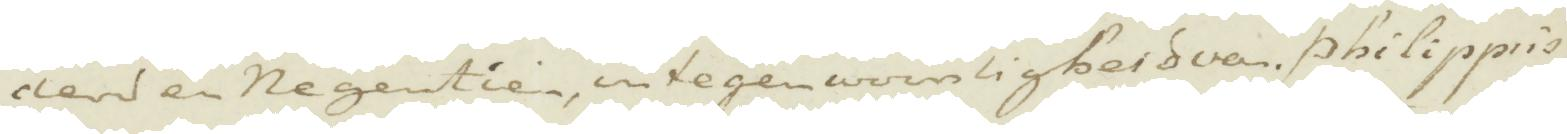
derd en Negentien, in tegenwoordigheid van Philippus
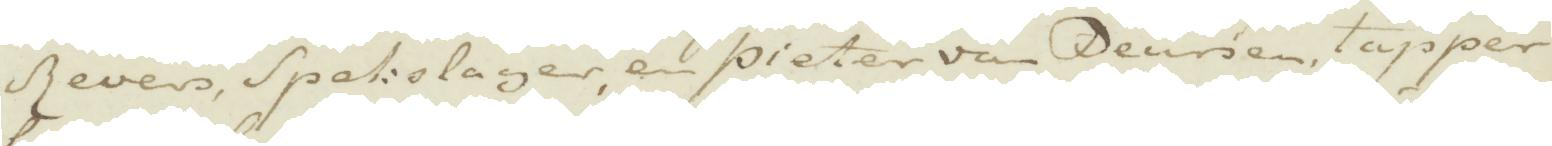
Revers, spekslager, en pieter van Deursen, tapper
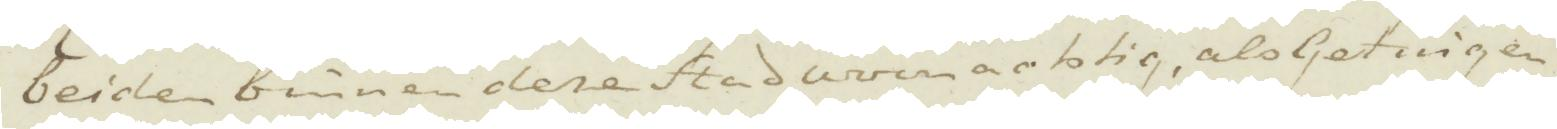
beiden binnen deze stad woonachtig, als Getuigen
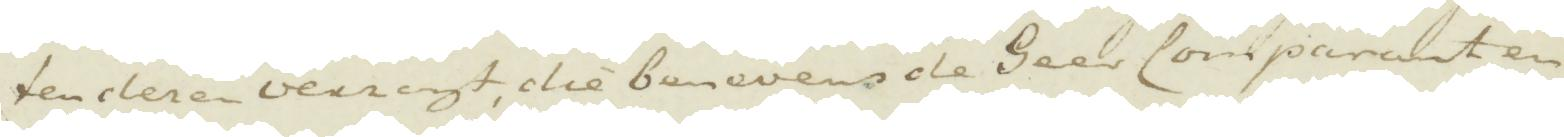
ten dezen verzogt, die benevens de heer Comparant en
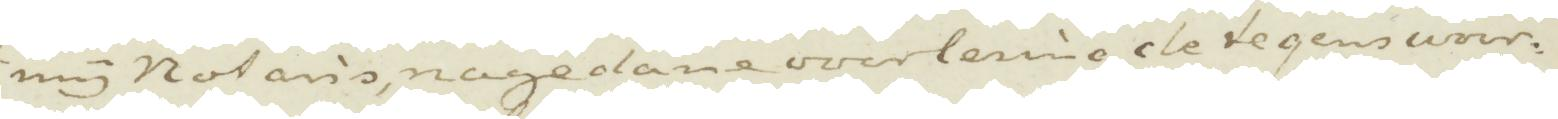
mij Notaris, nagedane voorlezing de tegens woor=
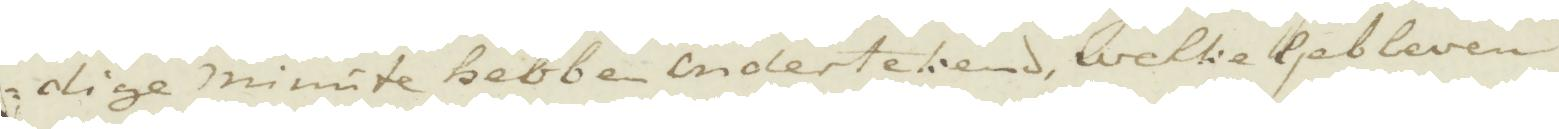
=dige minute hebben ondertekend, welke Gebleven
